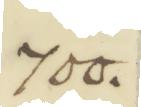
700.
